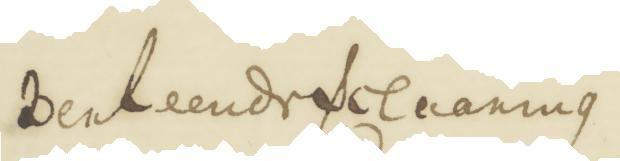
verleende verclaaring
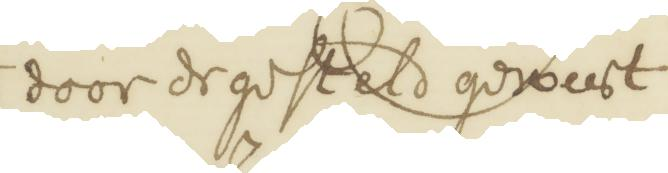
door de gesteld geweest
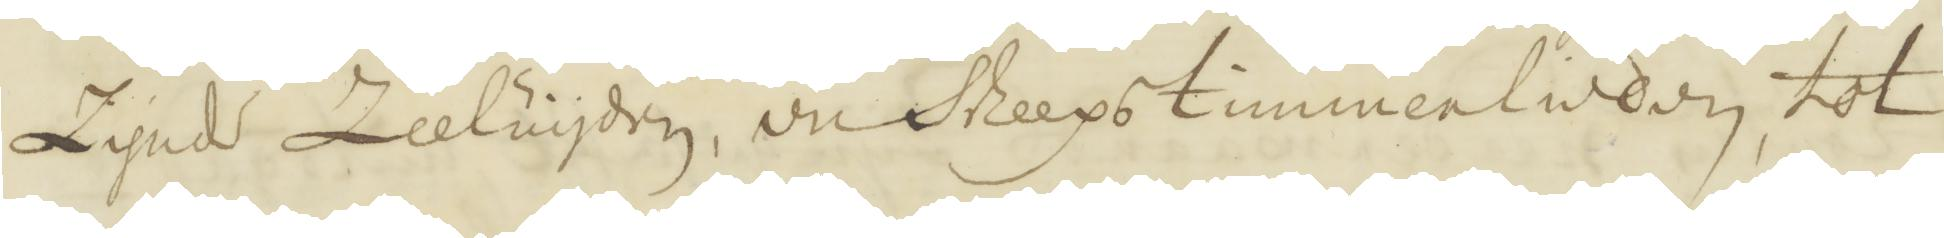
zijnde zeeluijden, en scheepstimmerlieden, tot
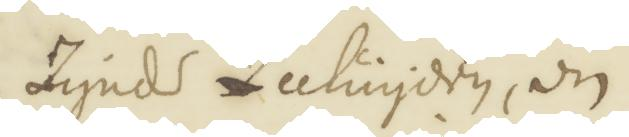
zijnde zeeluijden, en
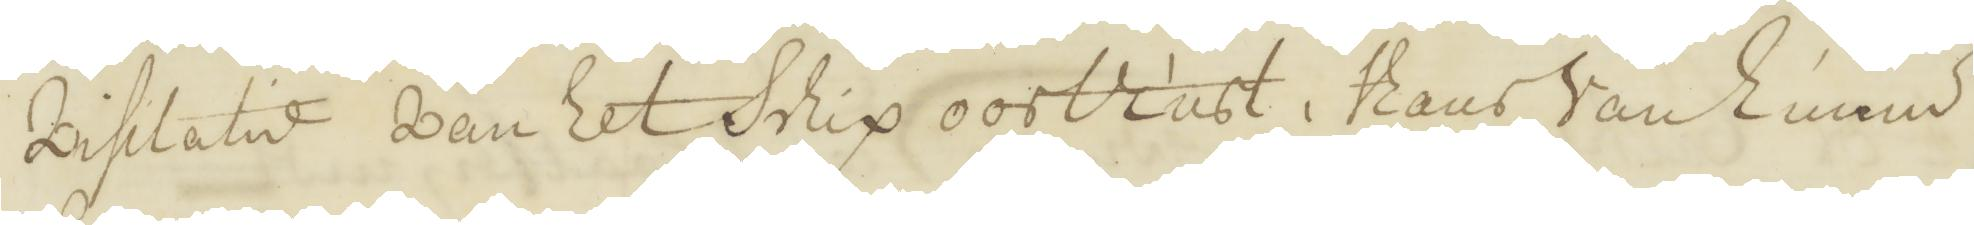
visitatie van het schip oostrust, thans van hunne
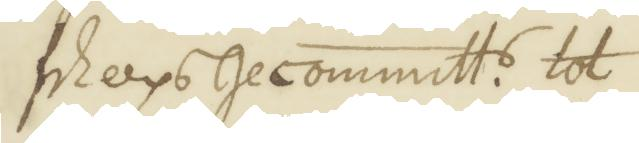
scheeps gecommitt.s tot
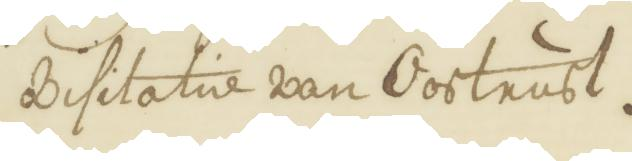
visitatie van Oostrust.
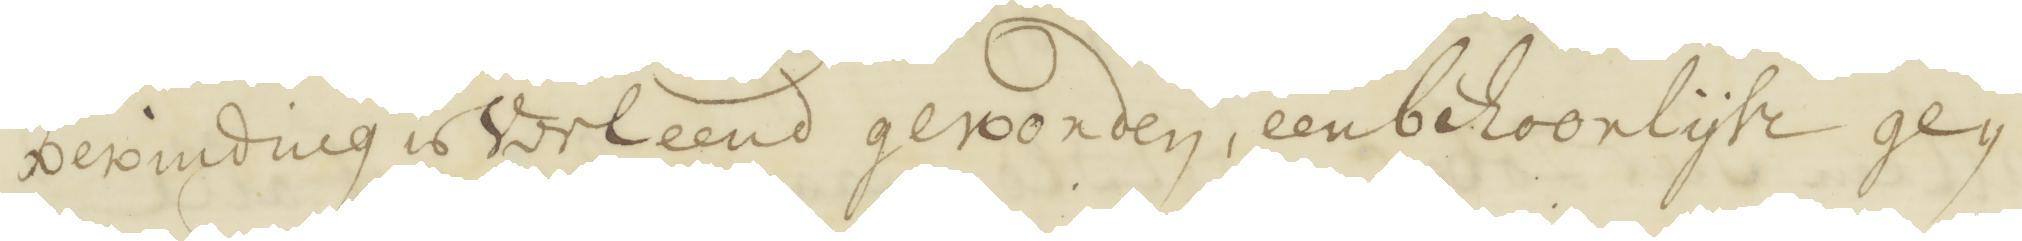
bevinding is verleend geworden, een behoorlijk ge
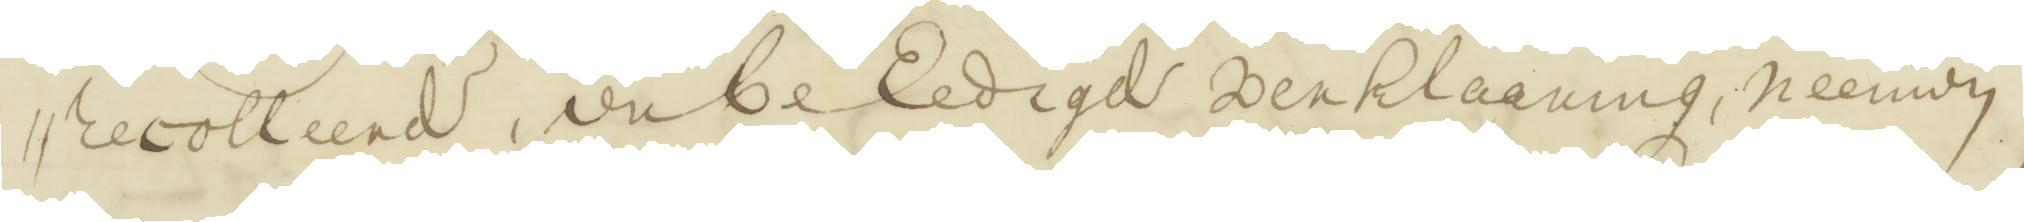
„recolleerde, en beEedigde verklaaring, neemen
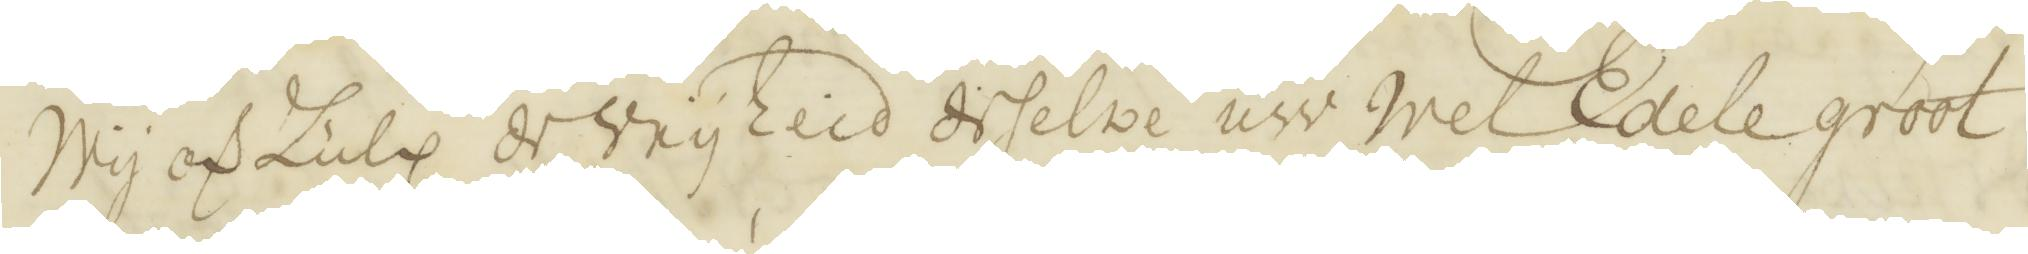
wij over zulx de vrijheid deselve uw wel Edele Groot
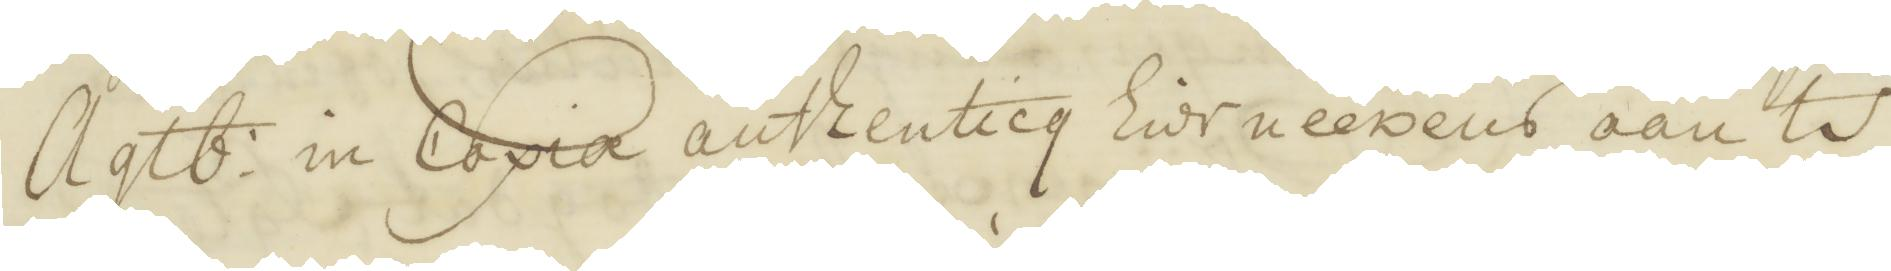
Agtb: in copia authenticq hier neevens aan te
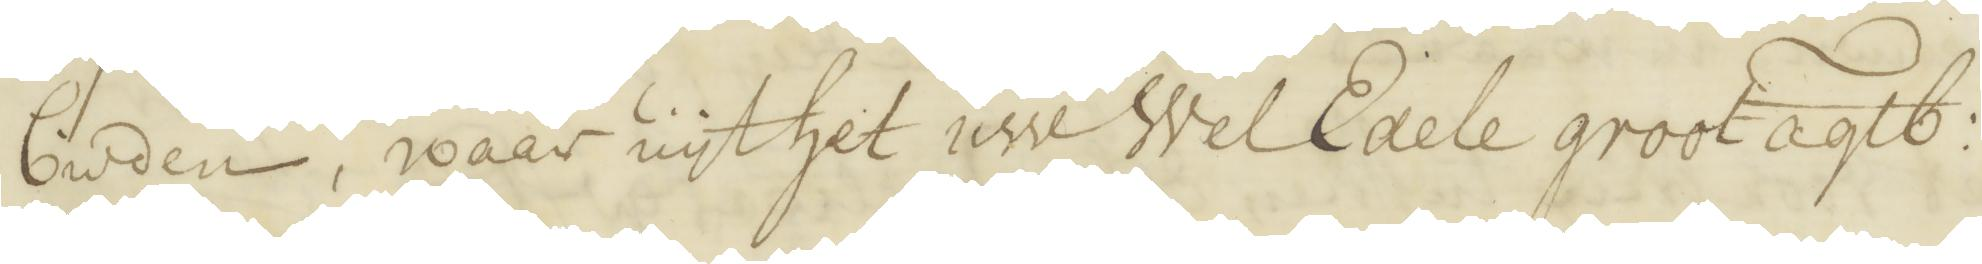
bieden, waar uijt het uw Wel Edele Groot Agtb:
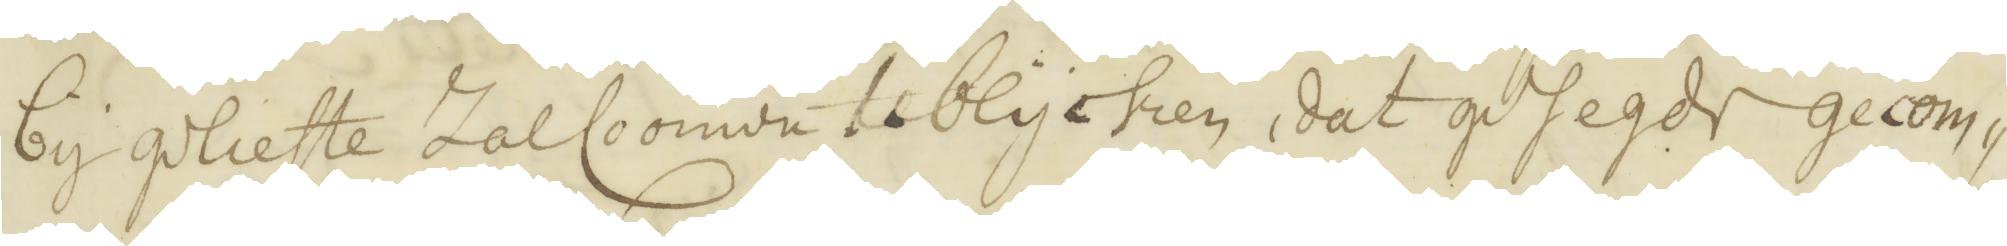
bij geliefte zal coomen teblijcken, dat gesegde gecom„
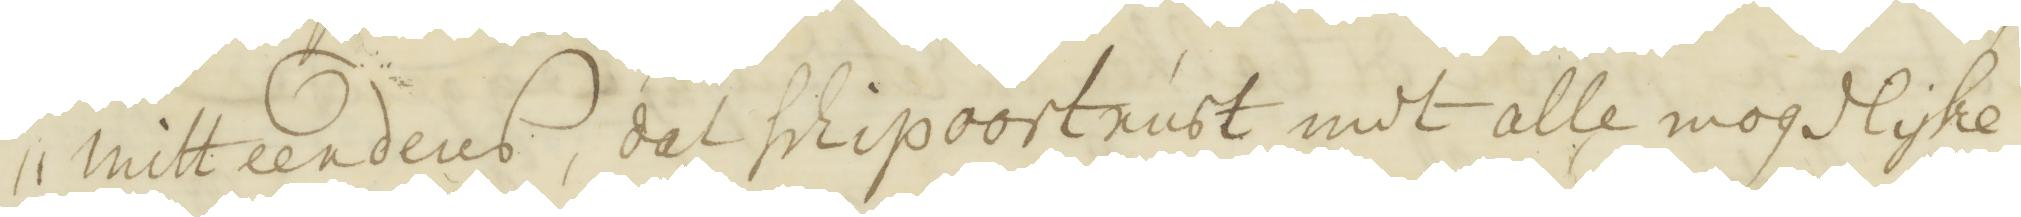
„mitteerdens, dat schip oortrust met alle mogelijke
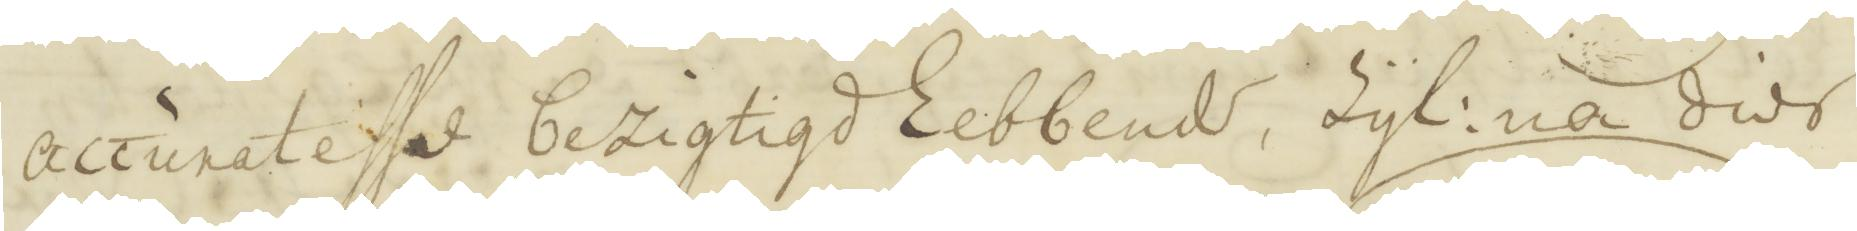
accuratesse bezigtigd hebbende, zijl: na dies
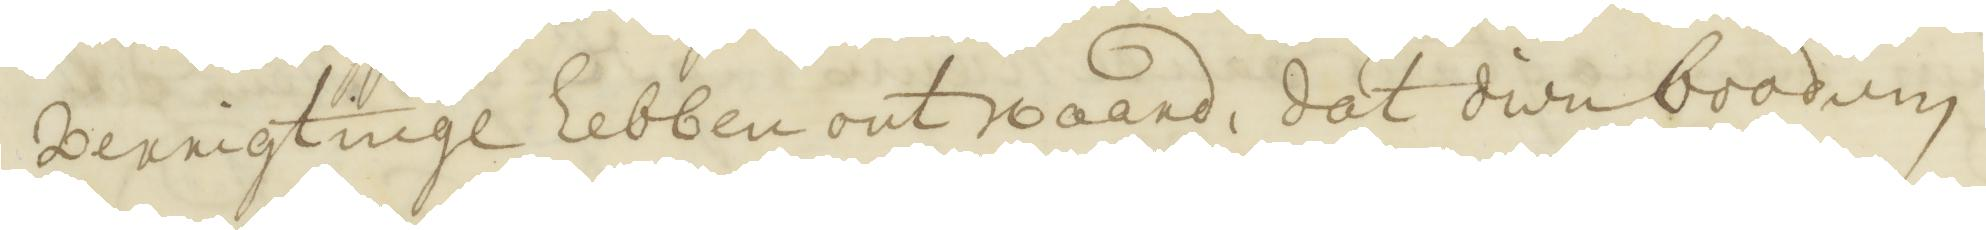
verrigtinge hebben ontwaard, dat dien boodem
